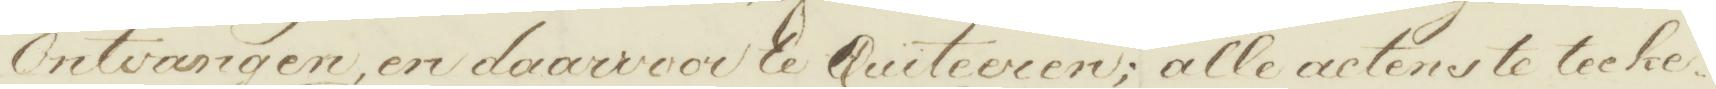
Ontvangen en daarvoor te Quiteeren; alle actens te teeke„
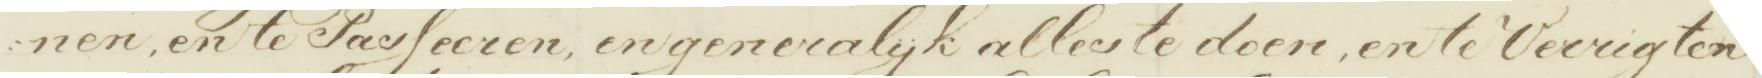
=nen, en te Passeeren, en generalijk alles te doen, en te verrigten
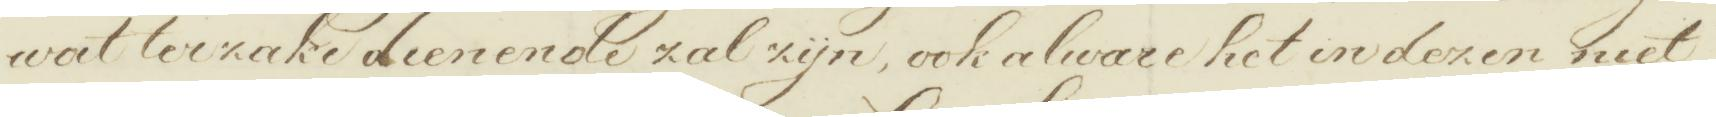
wat ter zake dienende zal zijn, ook alware het in dezen niet
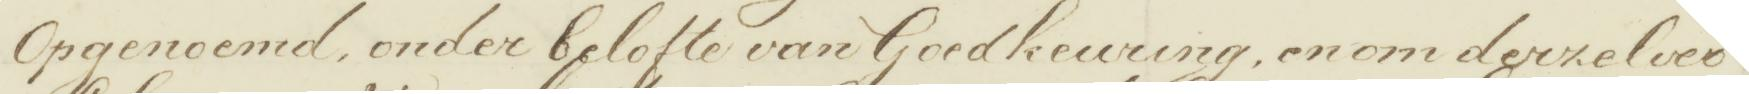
Opgenoemd, onder belofte van Goedkeuring, en om derzelver
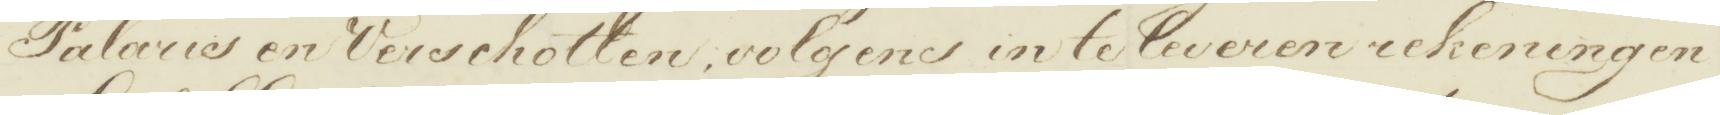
Salaris en Verschotten, volgens in te leveren rekeningen
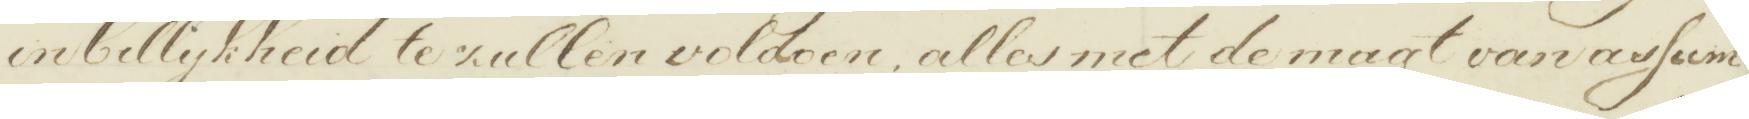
in billijkheid te zullen voldoen, alles met de magt van assum
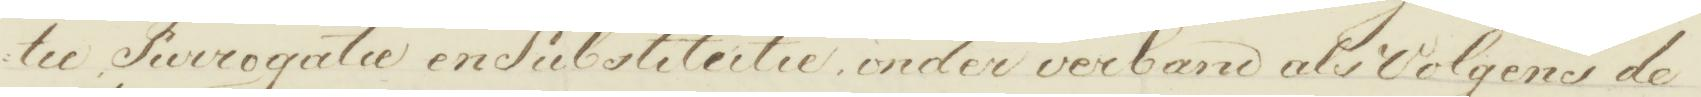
tie, Surrogatie en Substitutie, onder verband als volgens de
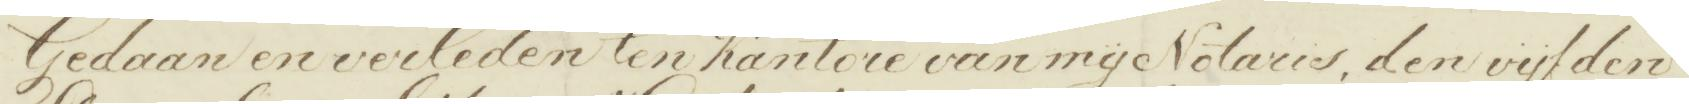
Gedaan en verleden ten kantore van mij Notaris, den vijf den
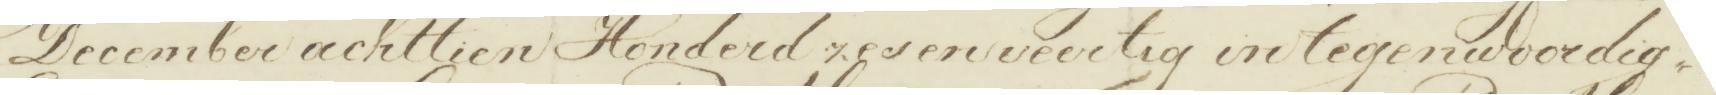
December achttien Honderd zes en veertig in tegenwoordig„
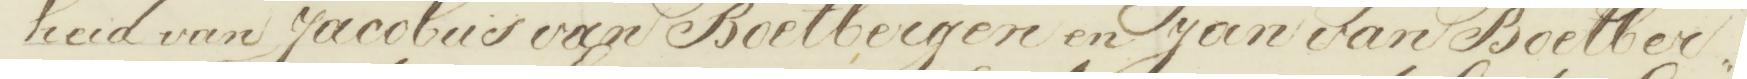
heid van Jacobus van Boetbergen en Jan van Boetber
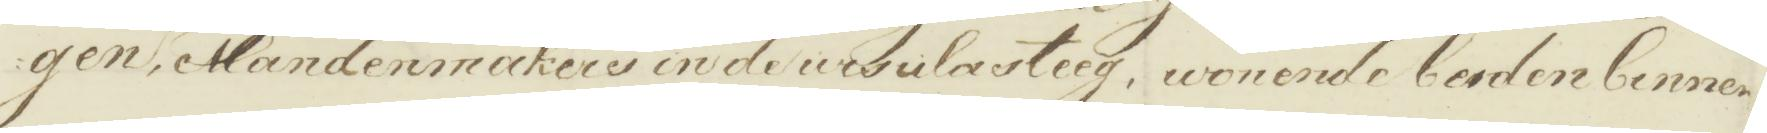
=gen, Mandenmakers in de ursulasteeg, wonende beiden binnen
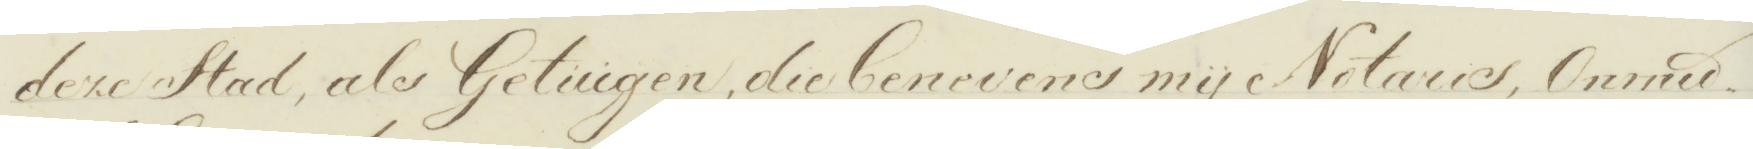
deze stad, als Getuigen, die benevens mij Notaris Onmid„
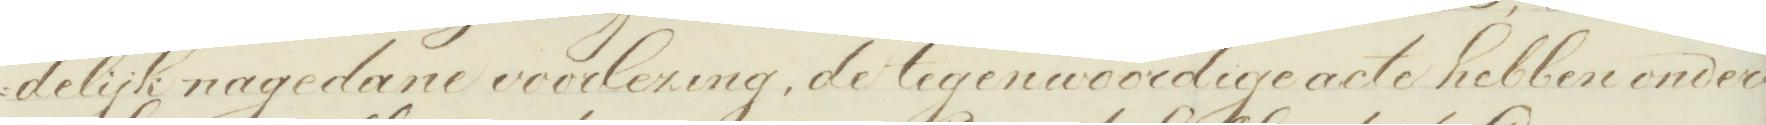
delijk nagedane voorlezing, de tegenwoordige acte hebben onder
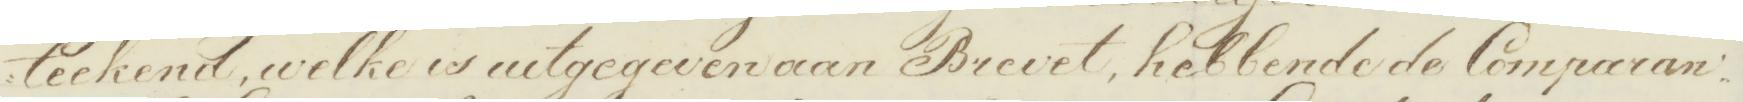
teekend, welke is uitgegeven aan Brevet, hebbende de Comparan„
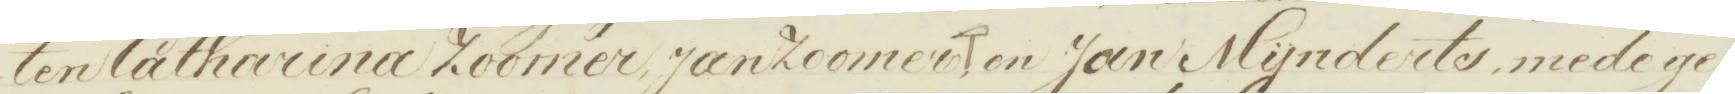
ten Catharina Zoomer, Jan Zoomer ¶ en Jan Mijnderts, mede ge
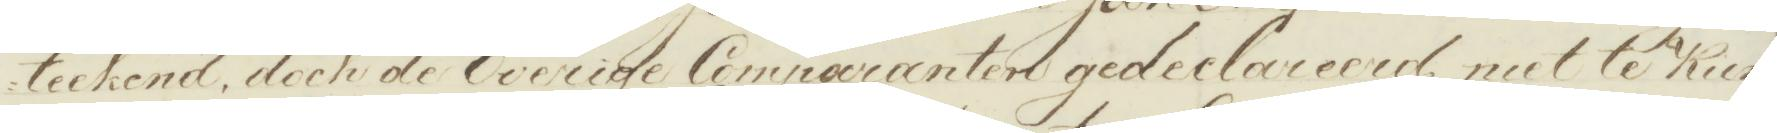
=teekend, doch de Overige Comparanten gedeclareerd niet te kun
